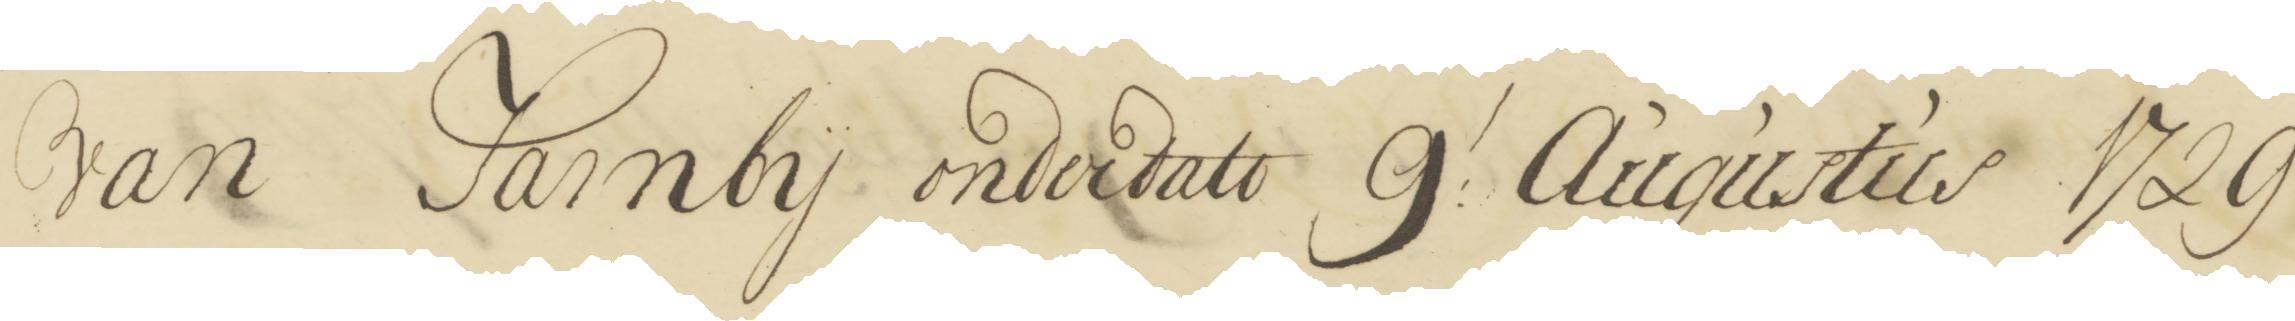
Van Jambij onderdato 9:' Augustus 1729
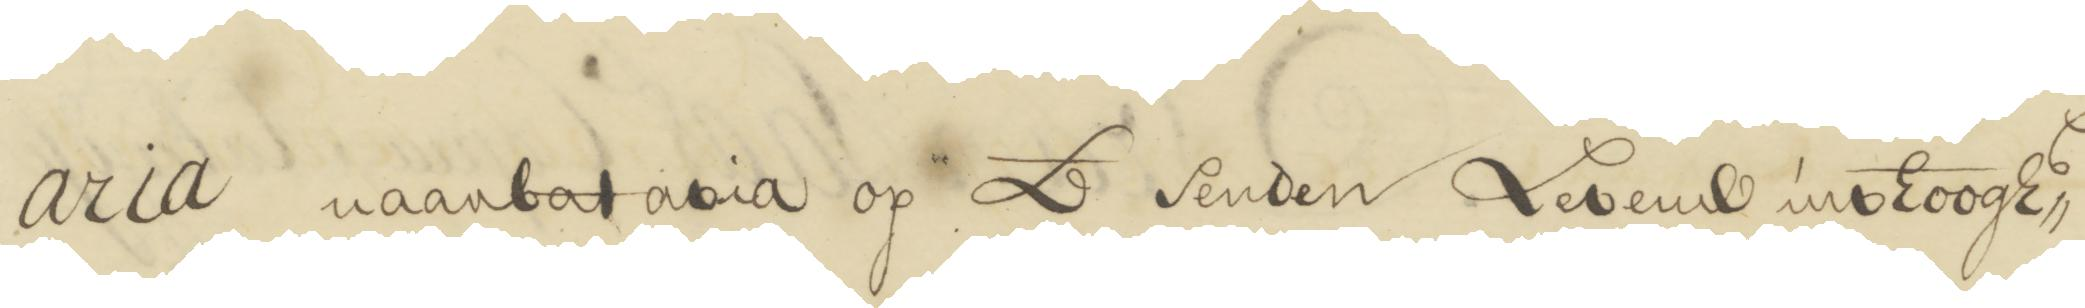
aria naar batavia op " te senden Levende int hoogh„e
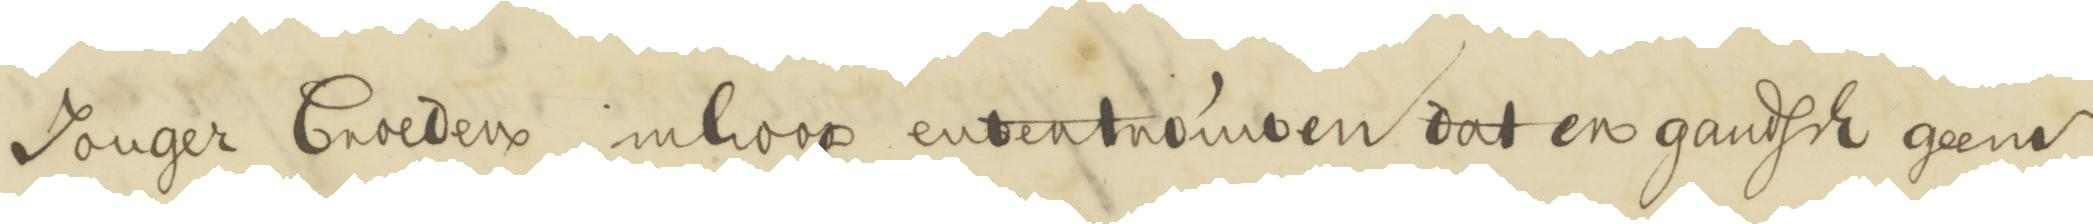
Jonger broeder in hoop en vertrouwen dat er gandser geene
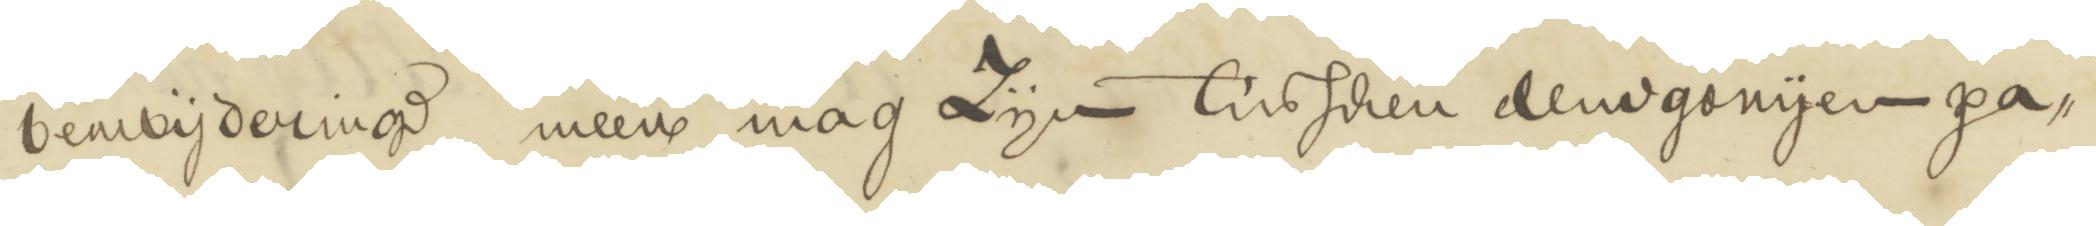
verwijderinge meer mag zijn tusschen de negorijen pa„
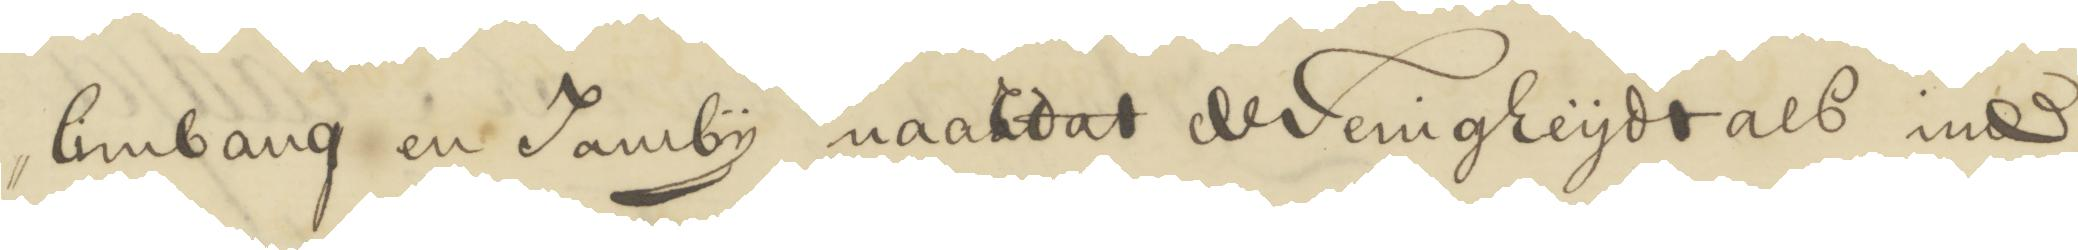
„linbang en Jambij naakdat de Eenigheijdt als inde
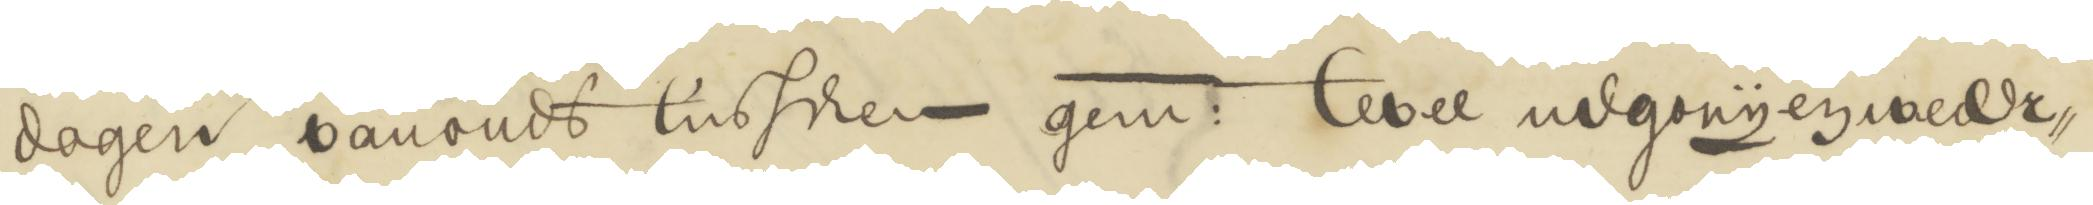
dagen vanouds tusschen gem: twee negorijen weder„
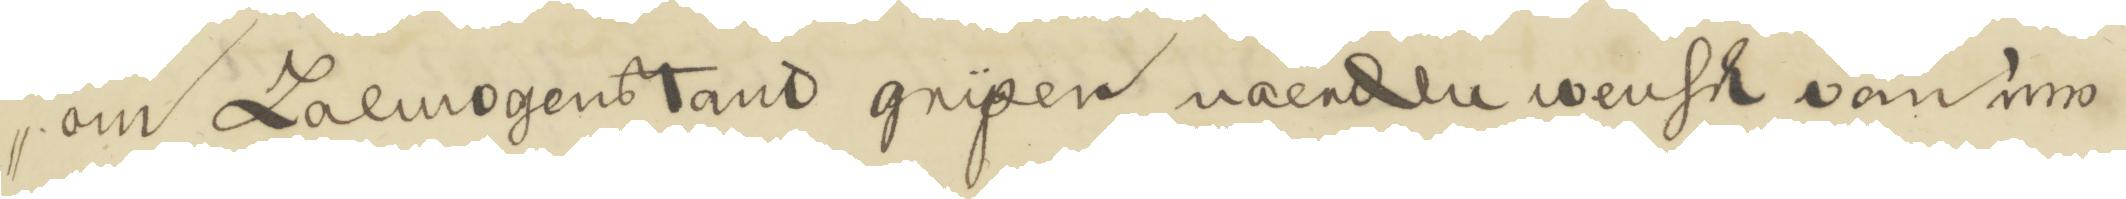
„om Zalmogenstand grijpen naerden wensch van uw
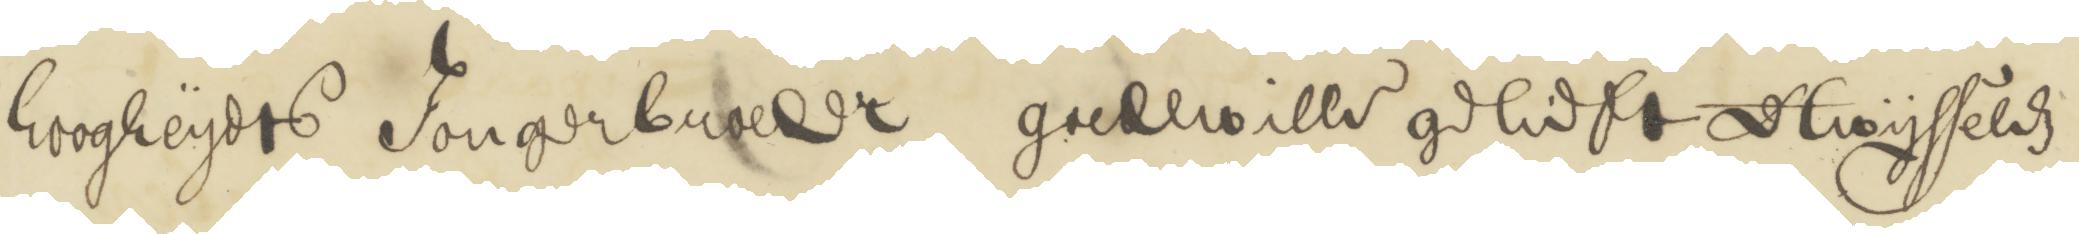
hoogheijdts Jonger broeder goedewille gelieft tetwijffelen
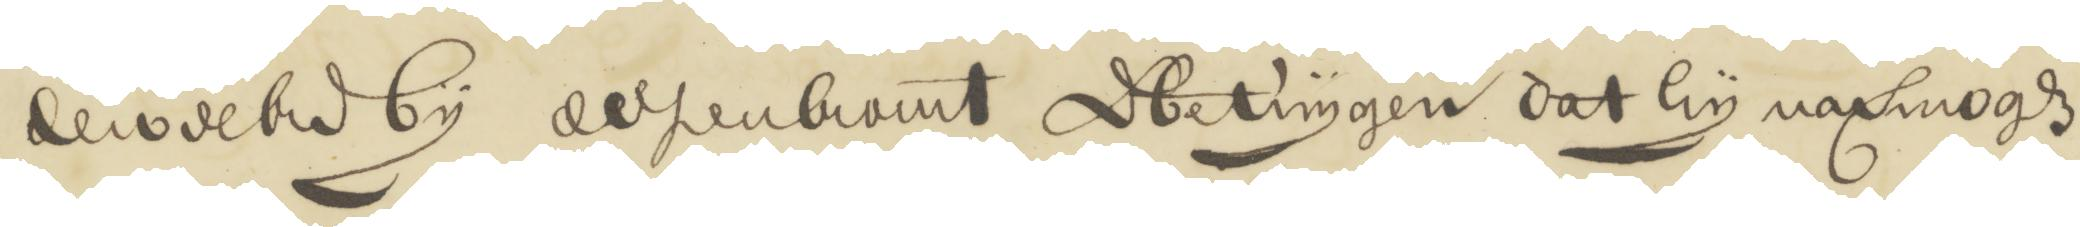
dewelke bij desenkomt tebetuijgen dat hij navermogen
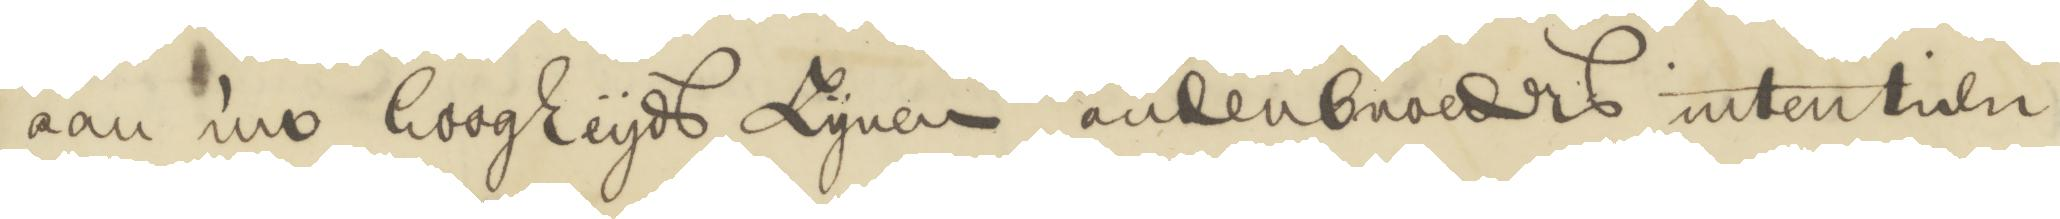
aan uw hoogheijds zijnen ouden broeders intentien
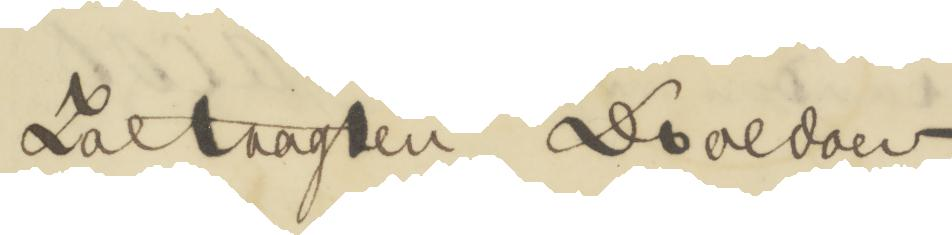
zal tragten tevoldoen
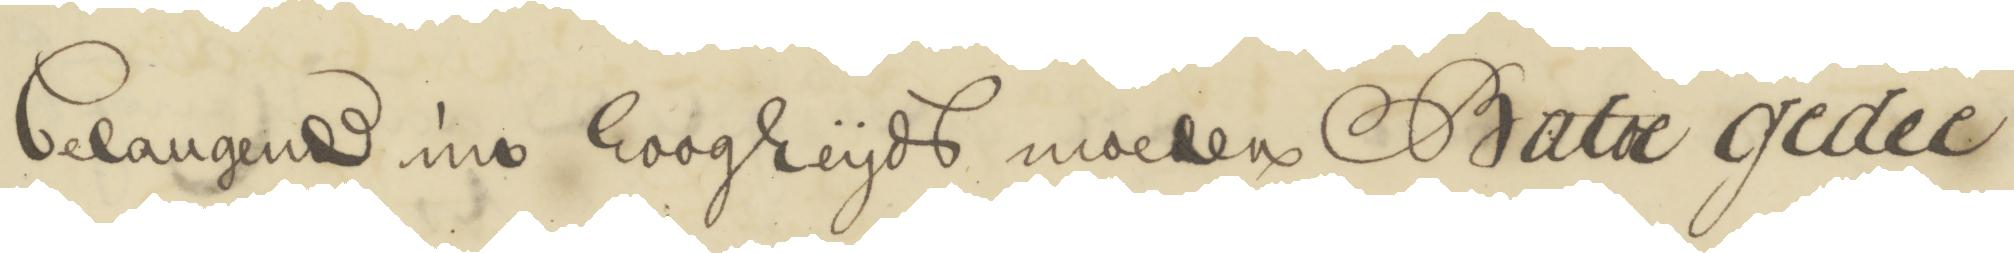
belangende int hoogheijds moeder Batoe gedee
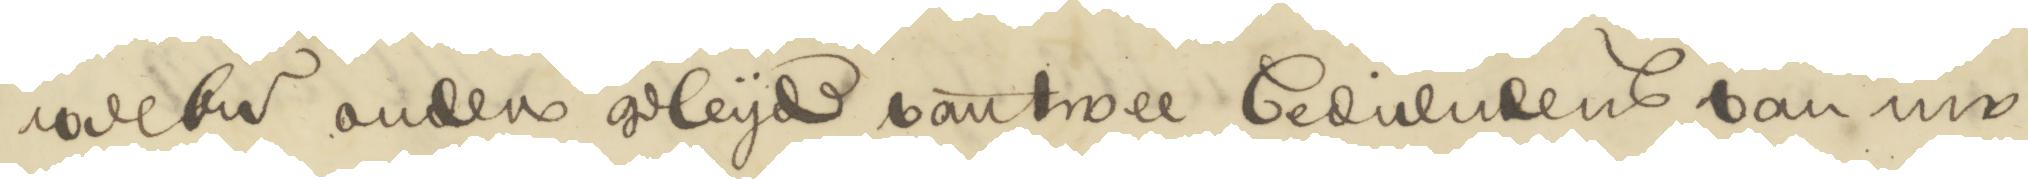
welke onder geleijde van twee bediendens van uw
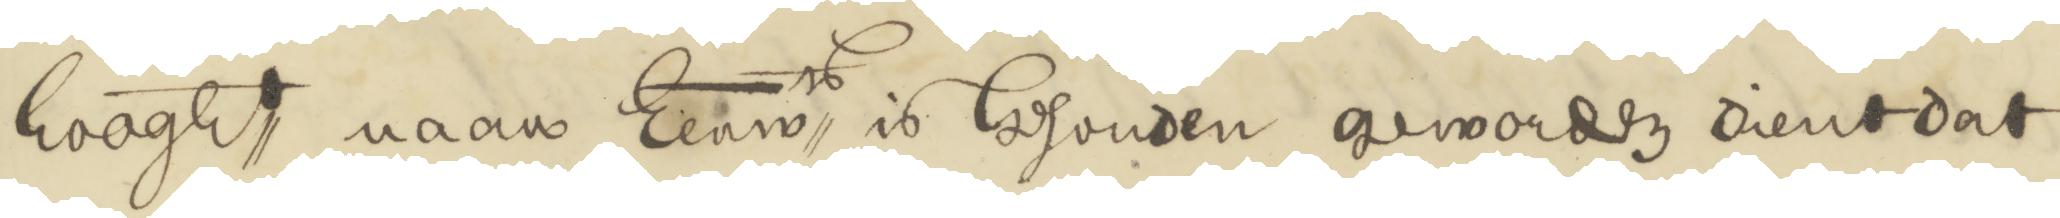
hoog„t naar Eerw„ts is besonden geworden dient dat
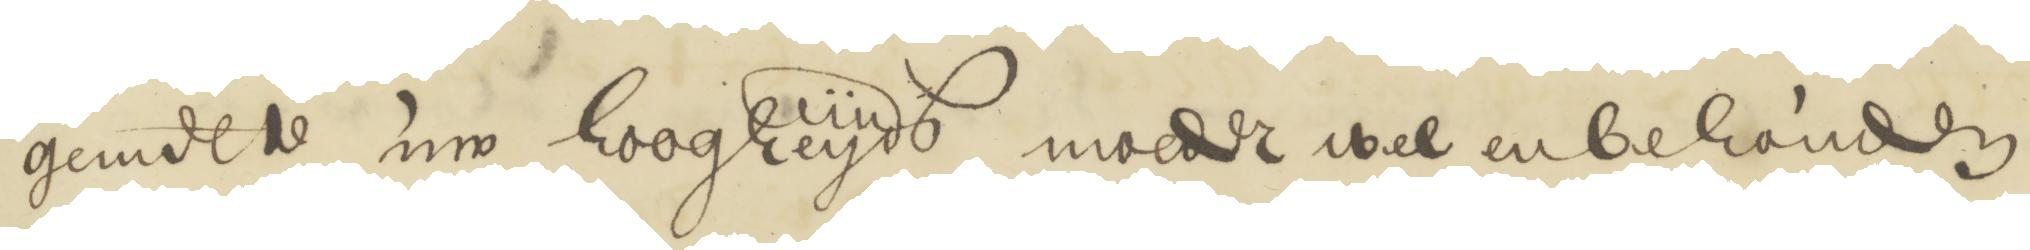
gemelte uw hoogheijds moeder wel en behouden
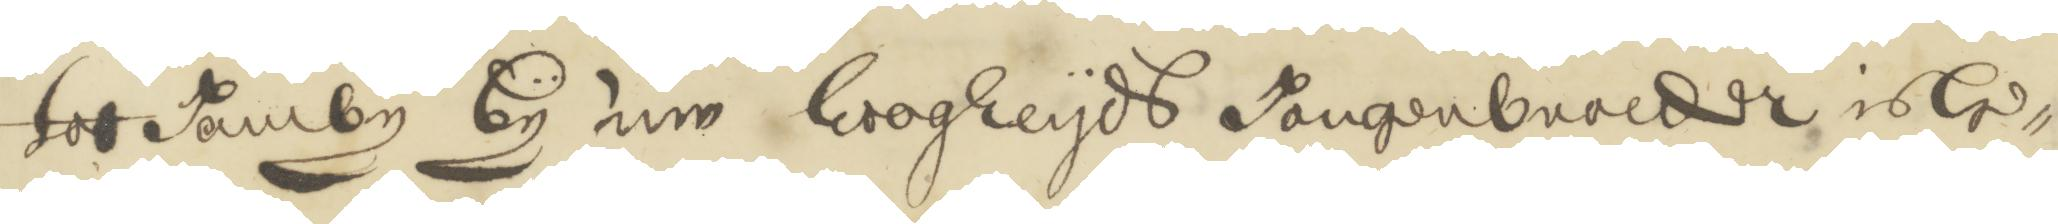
tot Jambij bij uw hoogheijds Jongen broeder is ge„
